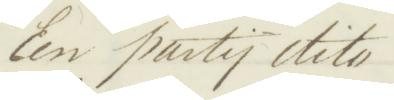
Een partij dito
